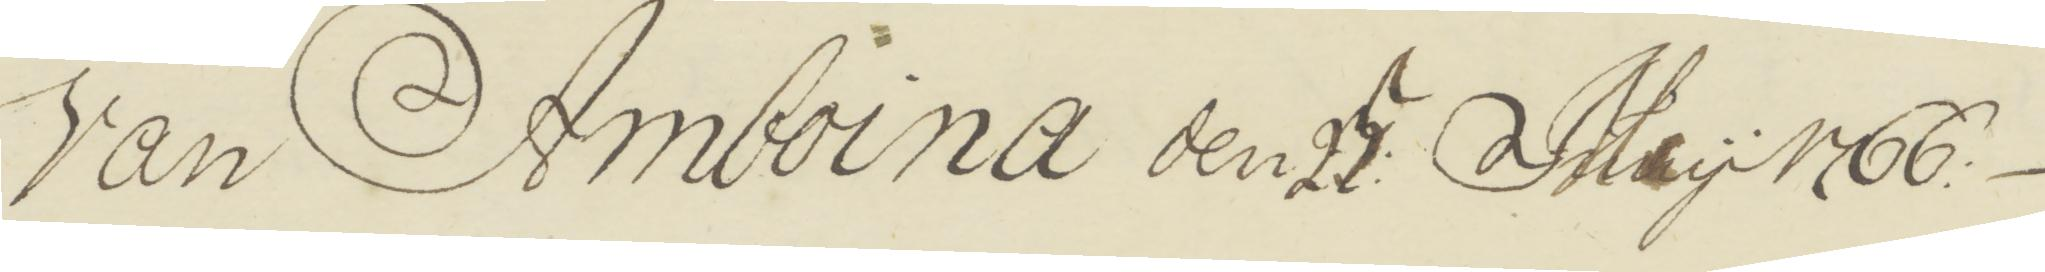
van Amboina den 25:' Maij 1766: —
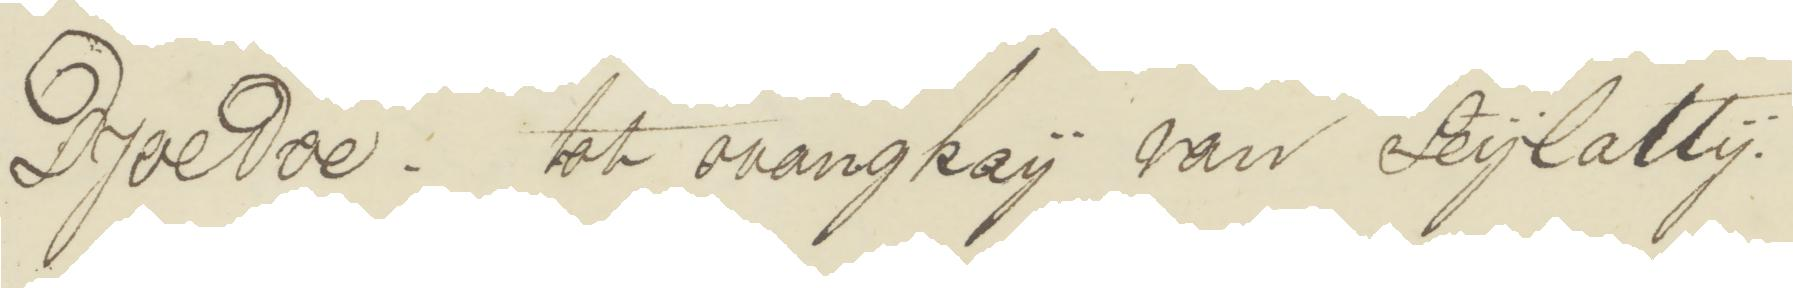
Djoedoe - tot orangkaij van Seijlattij.
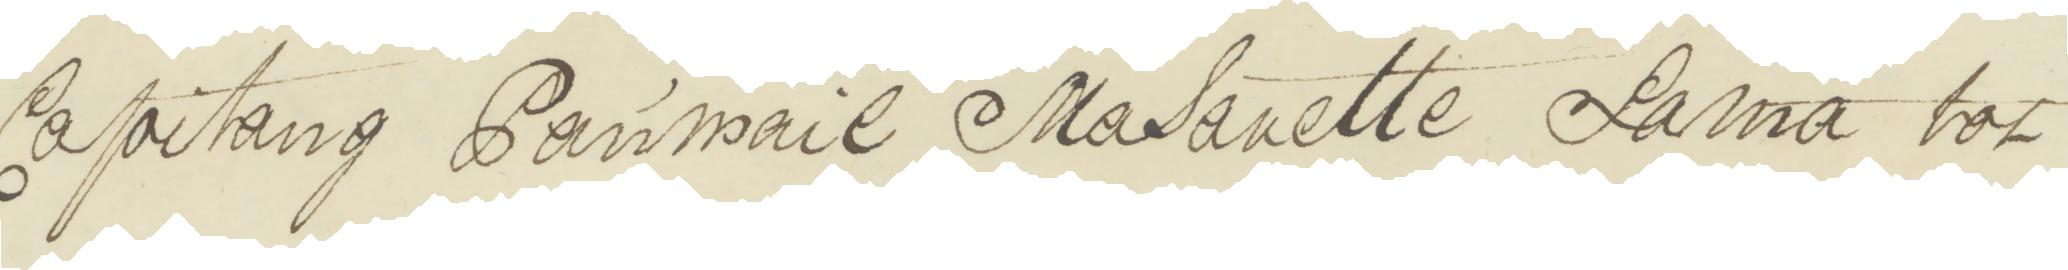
Capitang Pauwail Masarette Sama tot
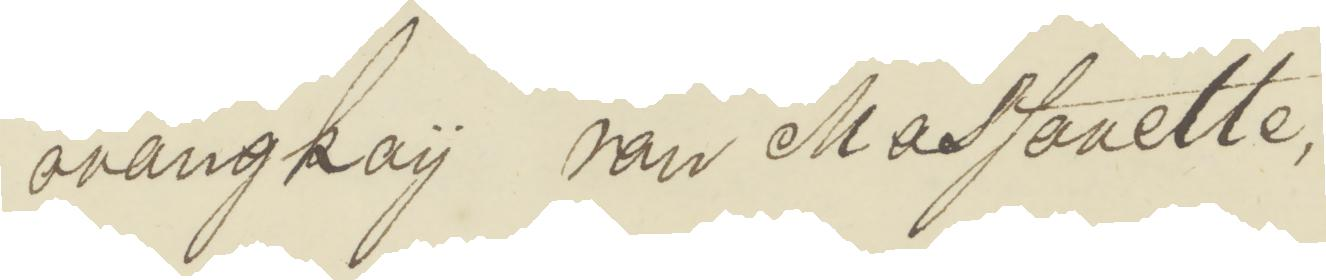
orangkaij van Massarette;
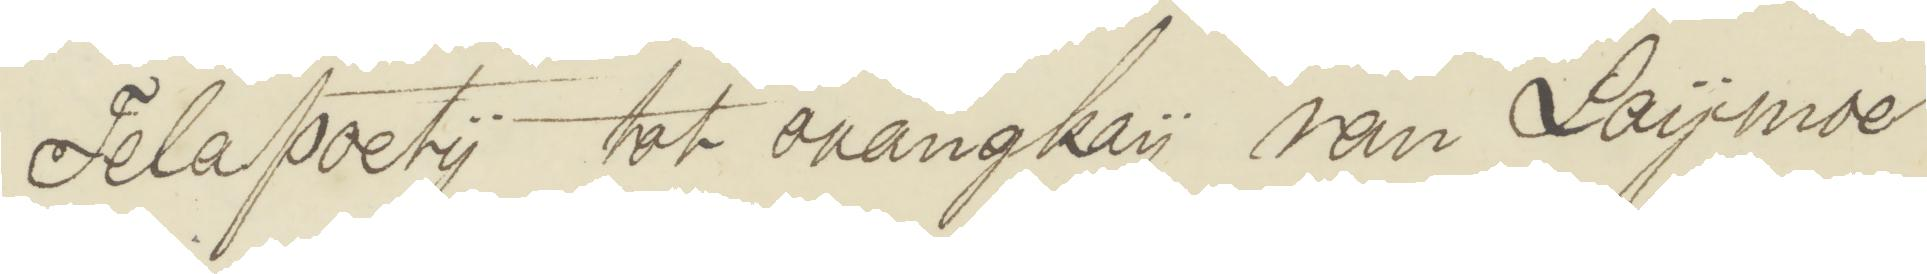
Telapoetij tot orangkaij van Laijmoe
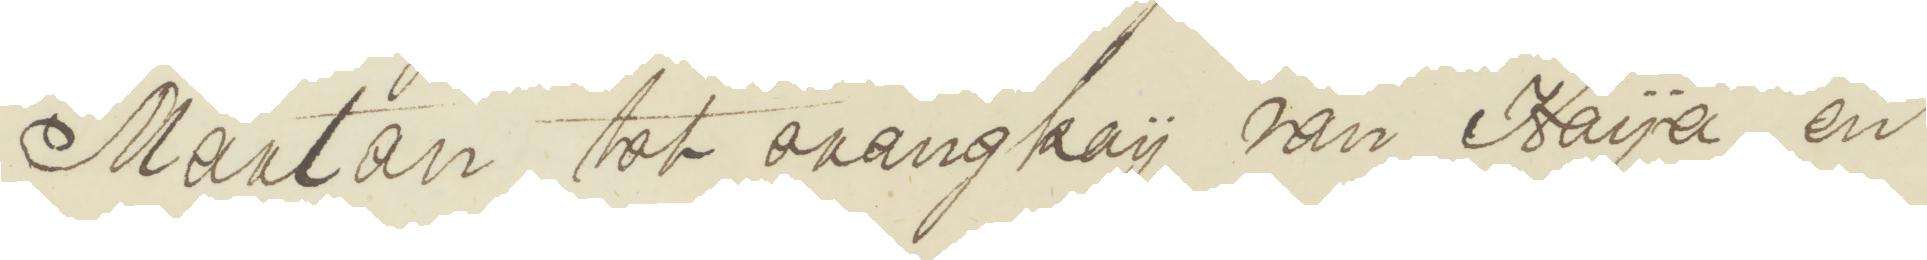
Martan tot orangkaij van Haija en
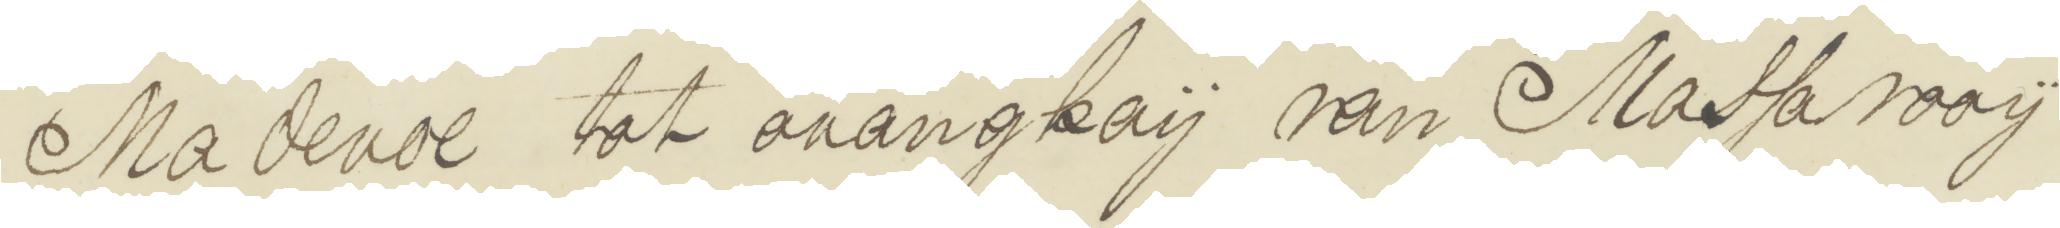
Maderoe tot orangkaij van Massavooij
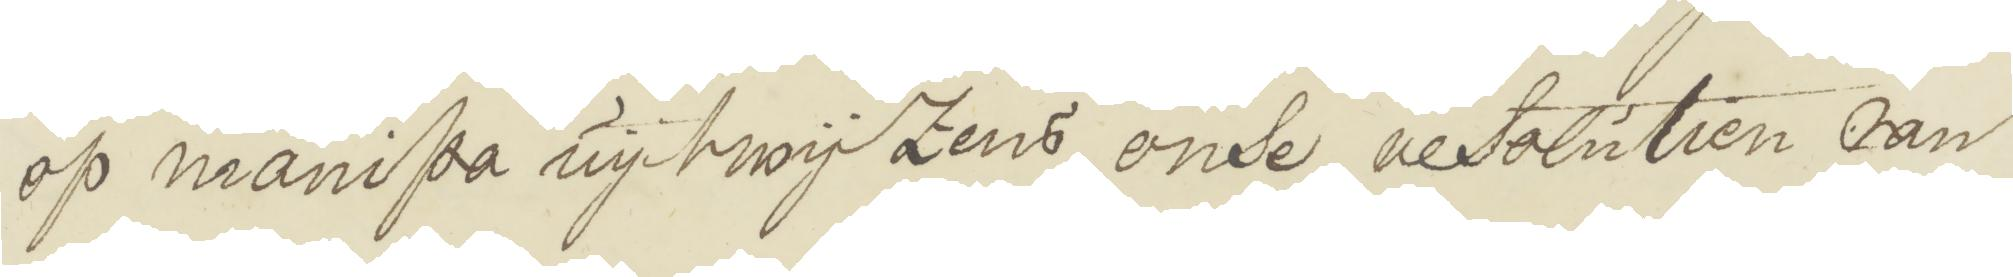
op manipa uijtwijzens onse resolutien van
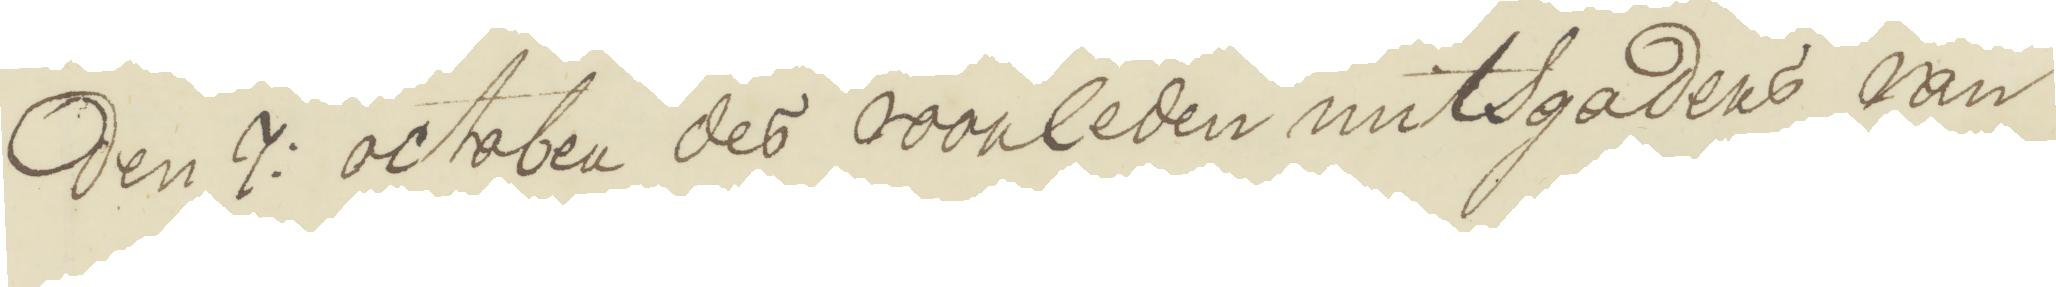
den 7: october des voorleden mitsgaders van
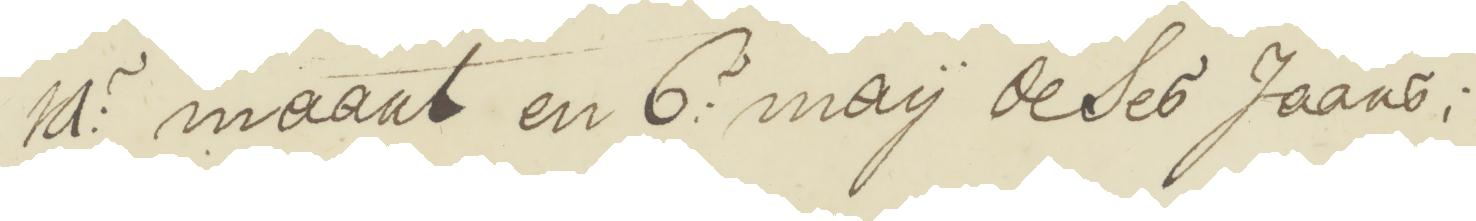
14:' maart en 6:' maij deses Jaars;
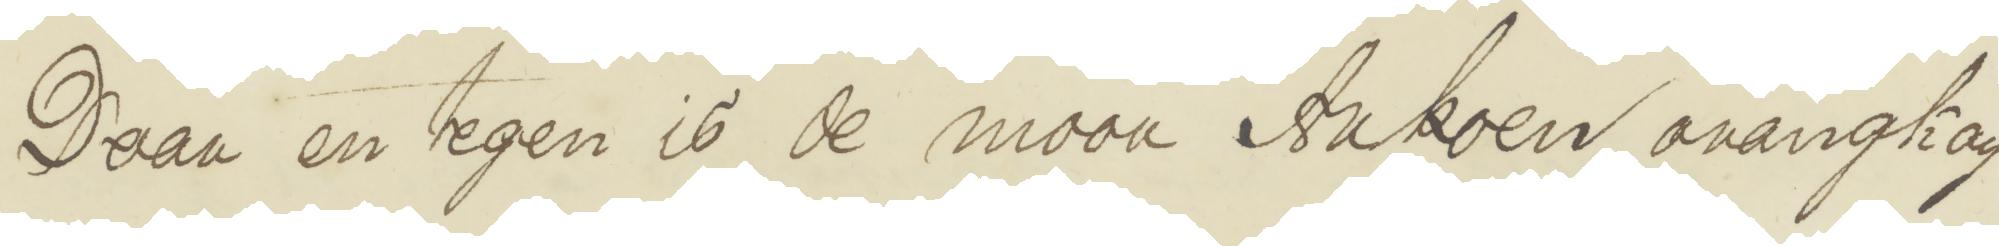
Daar en tegen is de moor Arkoen orangkaij
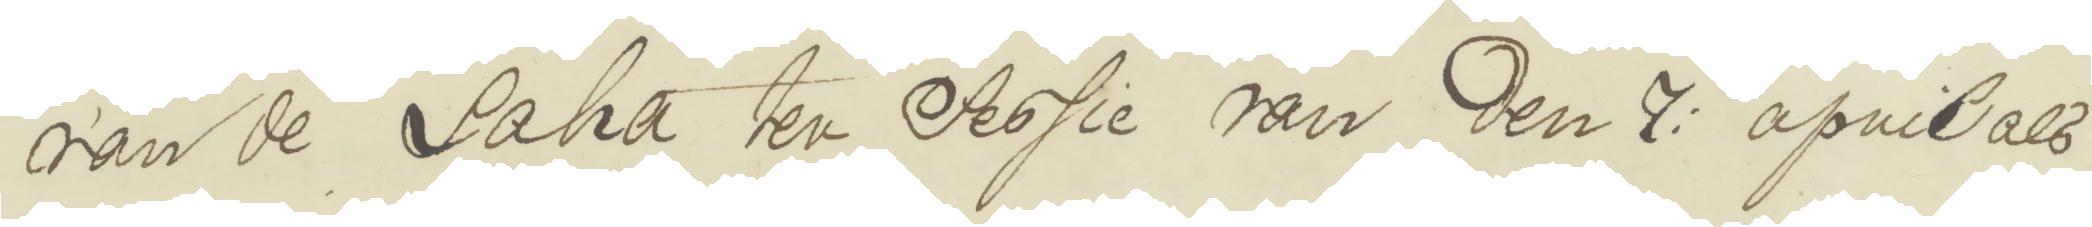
van de Saha ter sessie van den 7:' april als
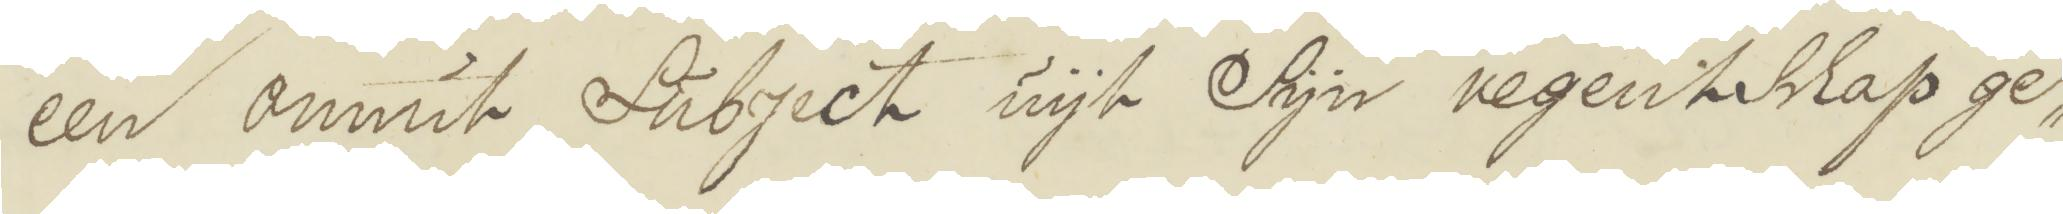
een onnut Subject uijt Sijn regentschap ge
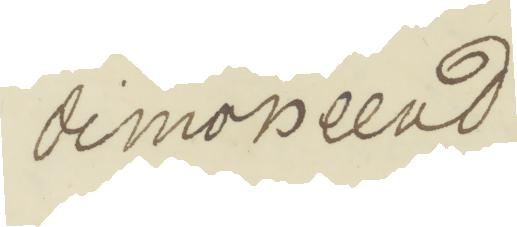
dimoveerd
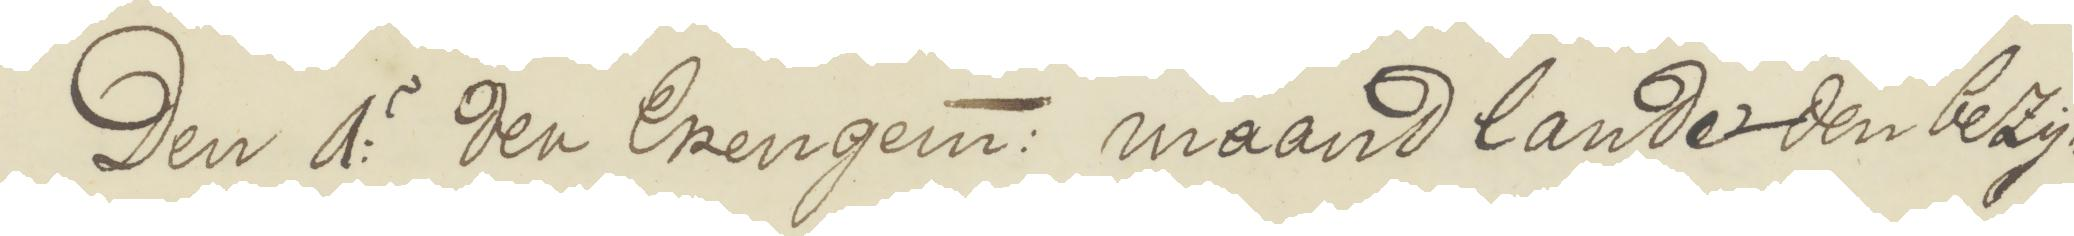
Den 4:' der Evengem: maand lande den bezij„
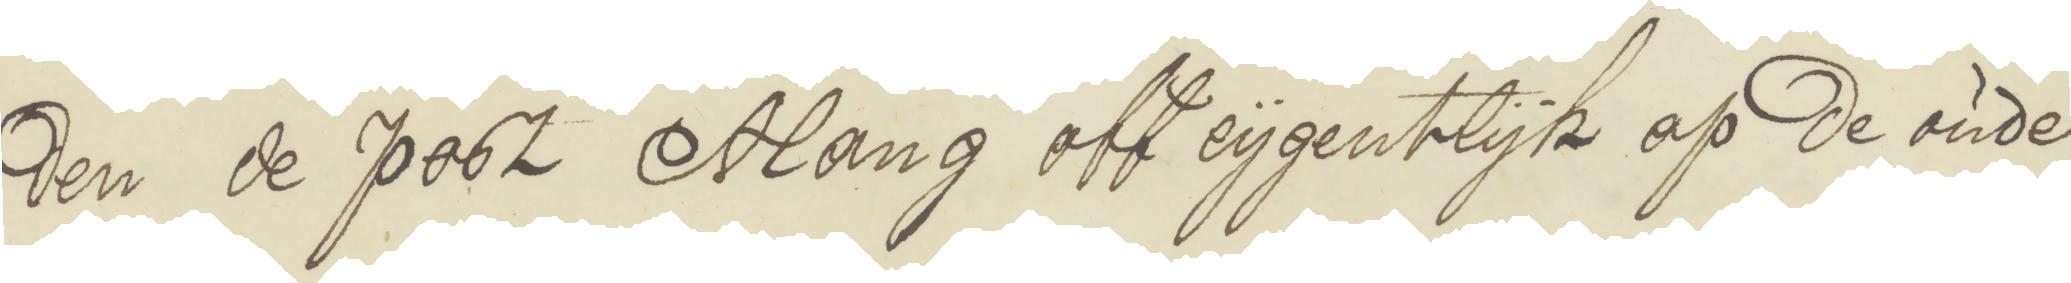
den de post Alang off eijgentlijk op de oude
